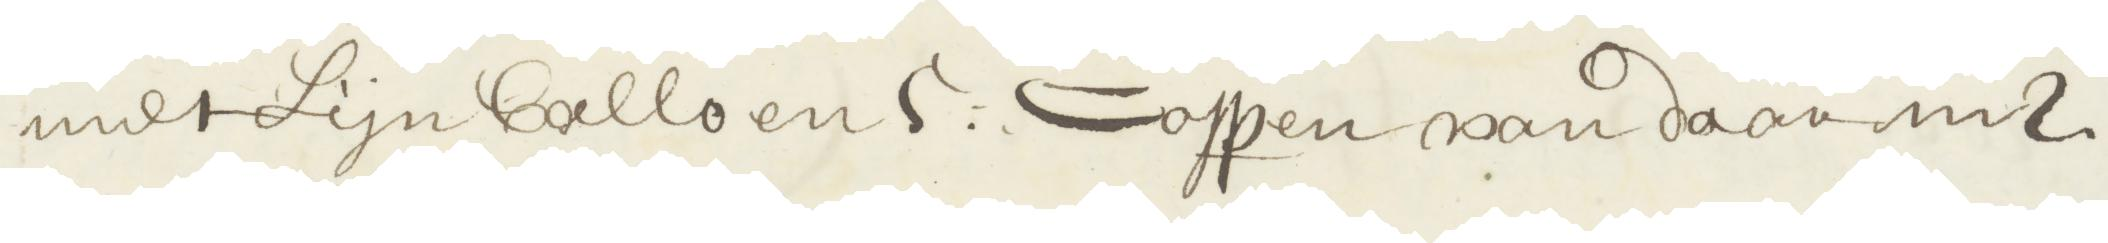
met sijn balloen 5: Coppen van daar in 2.
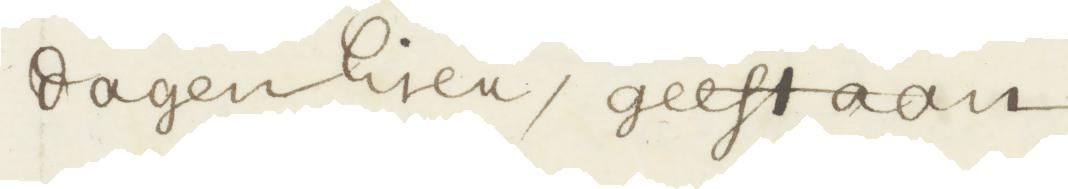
dagen hier, geeft aan
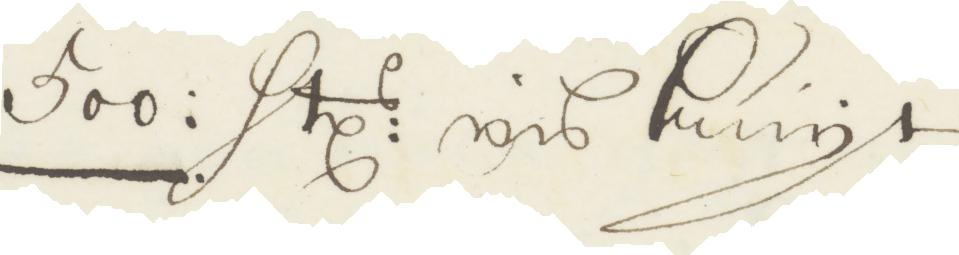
500: stx:s vis kuijt
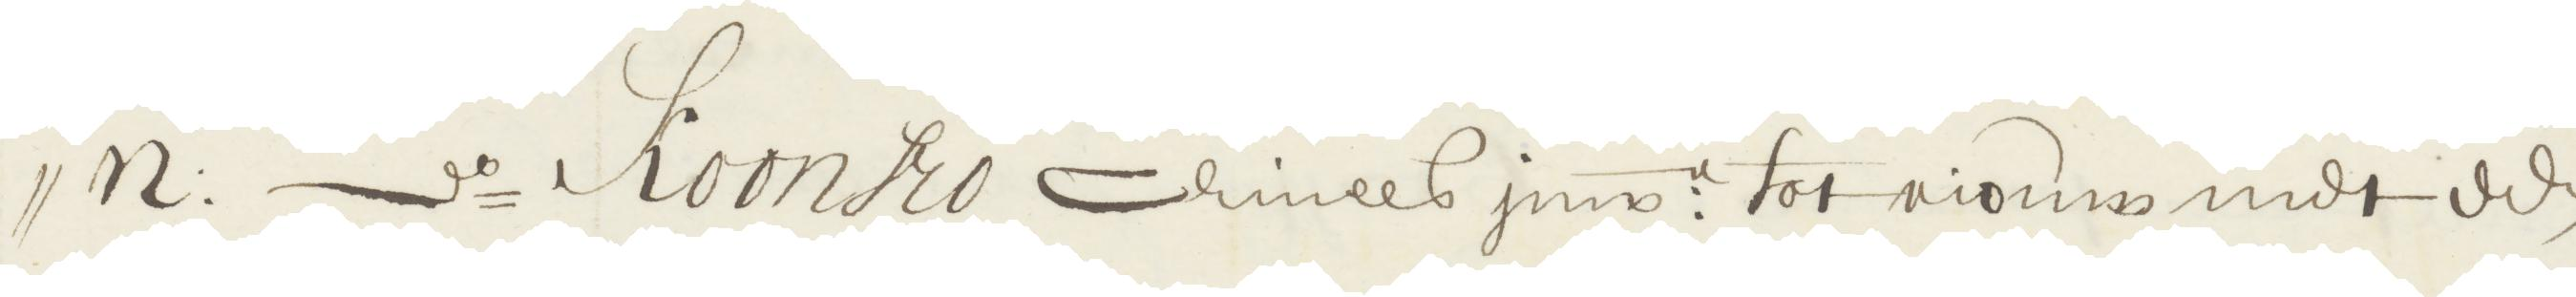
„ 12: _=o Koonko Chinees jnw:r tot riouw met een
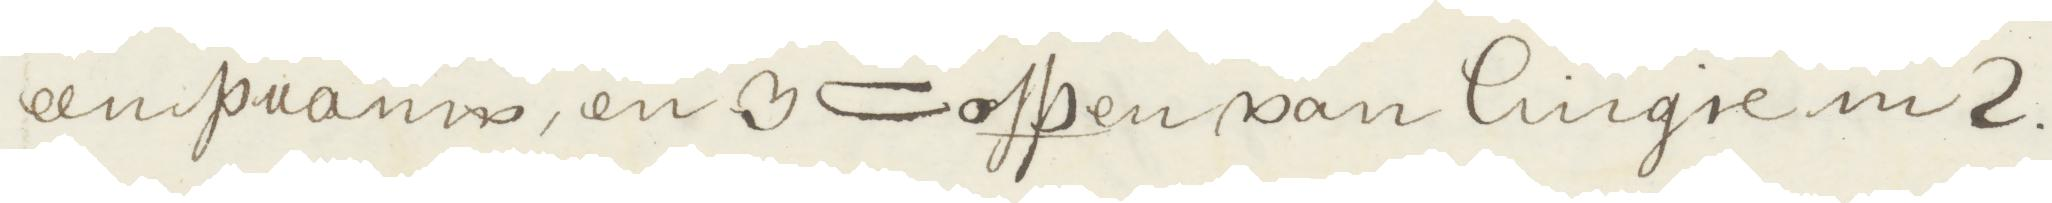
een prauw, en 3 Coppen van lingie in 2.
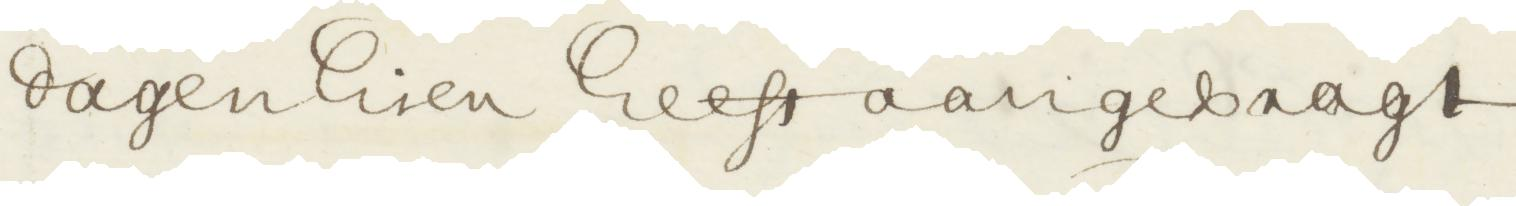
dagen hier heeft aangebragt
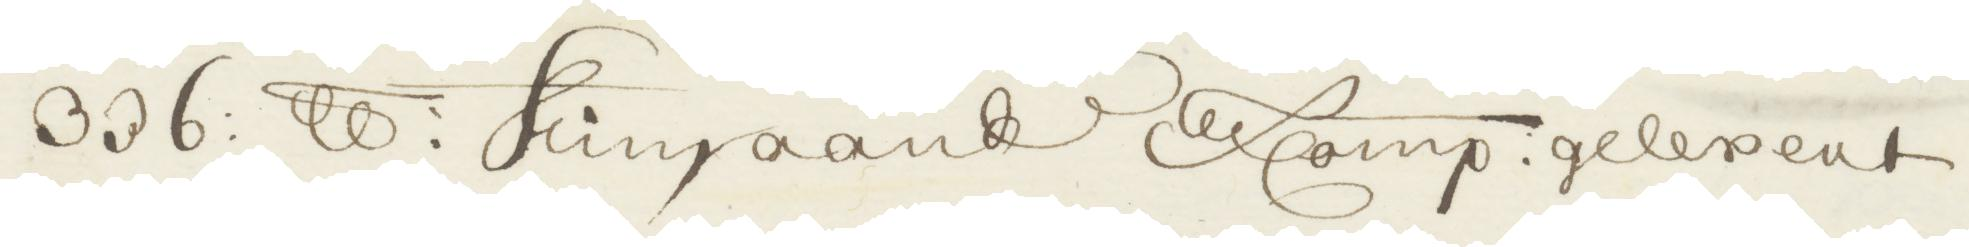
336: lb: thin aan de EComp: gelevert
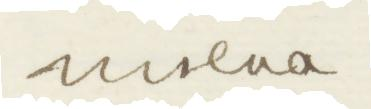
milra
